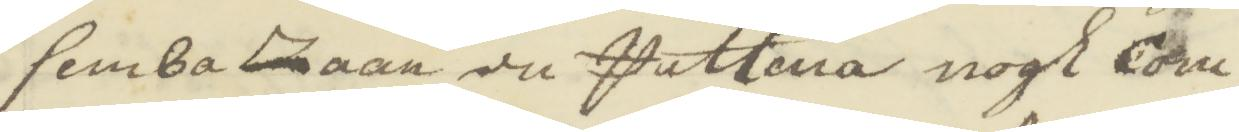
sembazaar en Pattena nogh Com
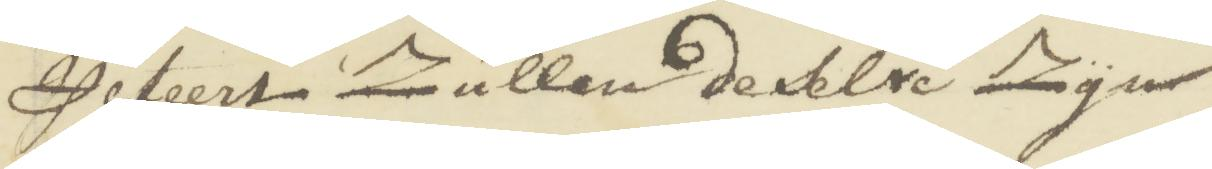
peteert Zullen deselve Zijn
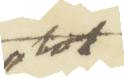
tot
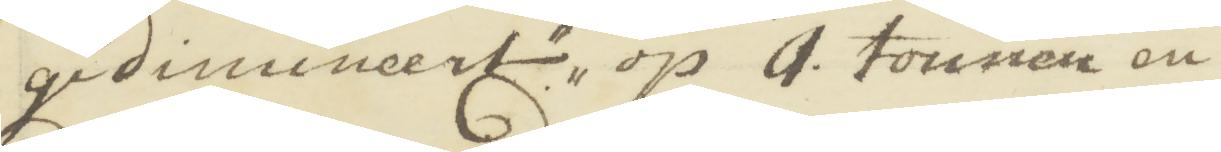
gedimineert „ op 4. tonnen en
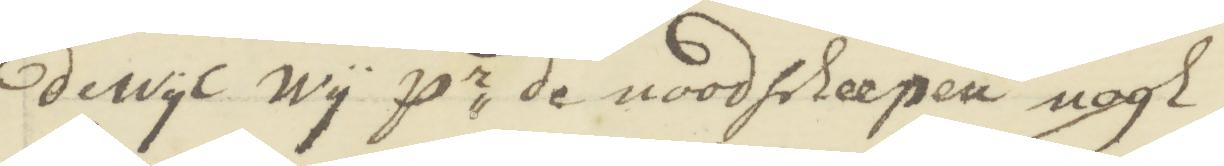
dewijl wij p„r de noodscheepen nogh
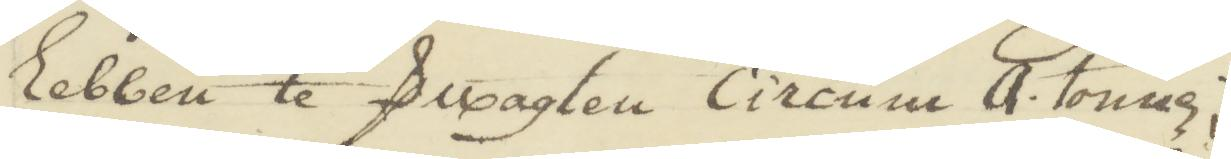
hebben te verwagten Circum 4. tonnen;
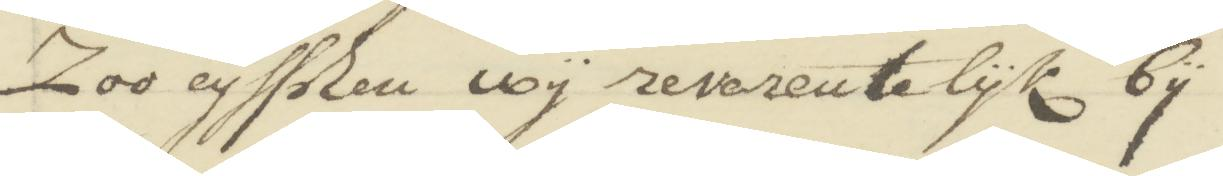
Zoo eijsschen wij reverentelijk bij
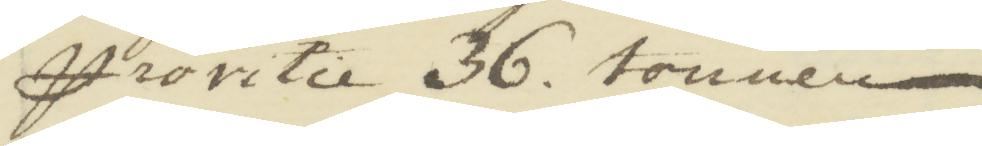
provitie 36. tonnen
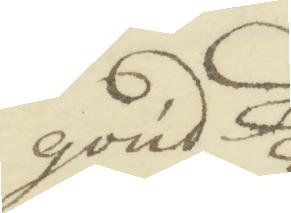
goud
